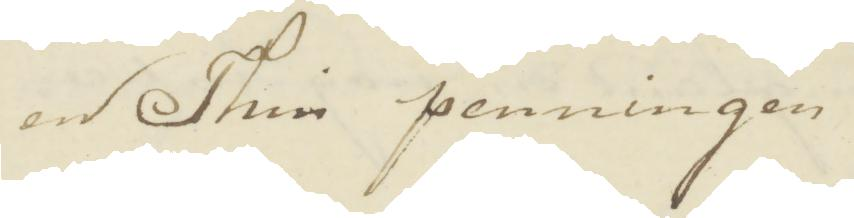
en Thin penningen
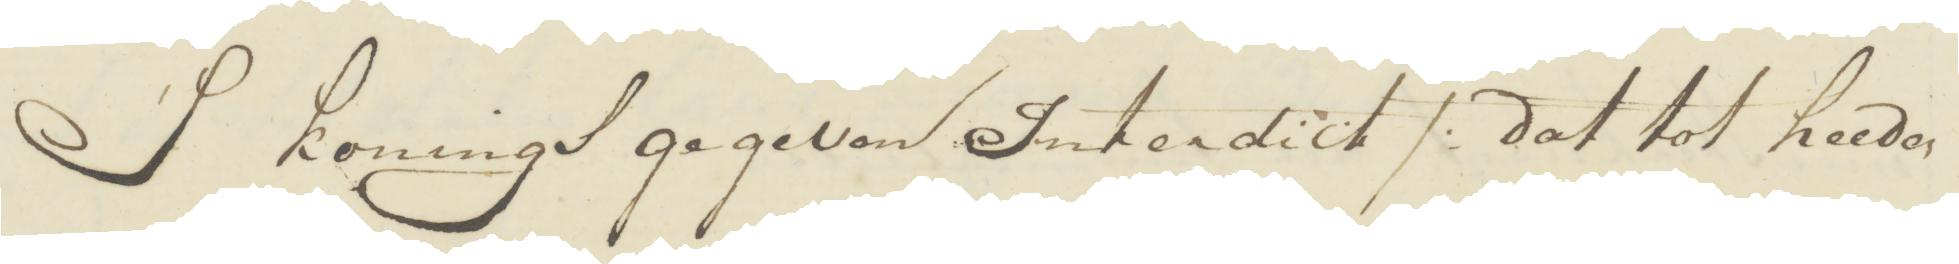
'S konings gegeven Interdict /:dat tot heeden
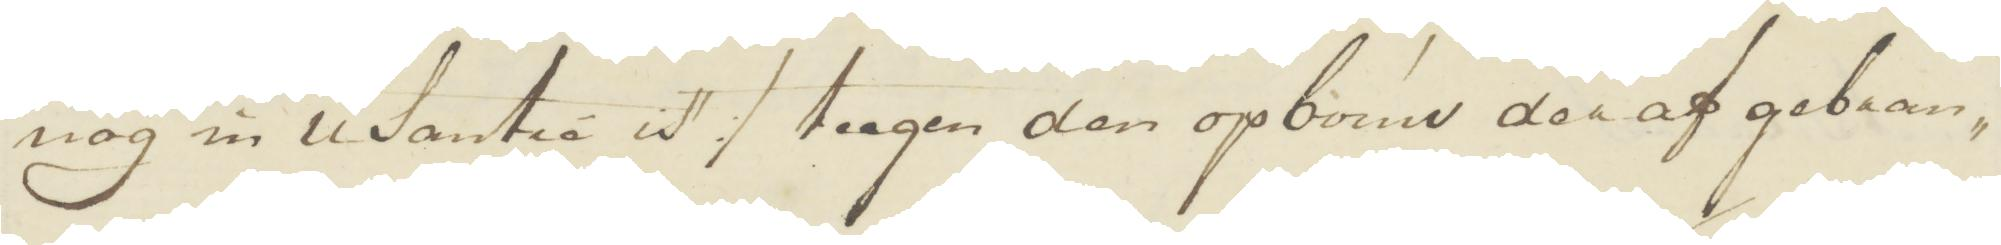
nog in usantie is :/ teegen den opbouw der afgebran„
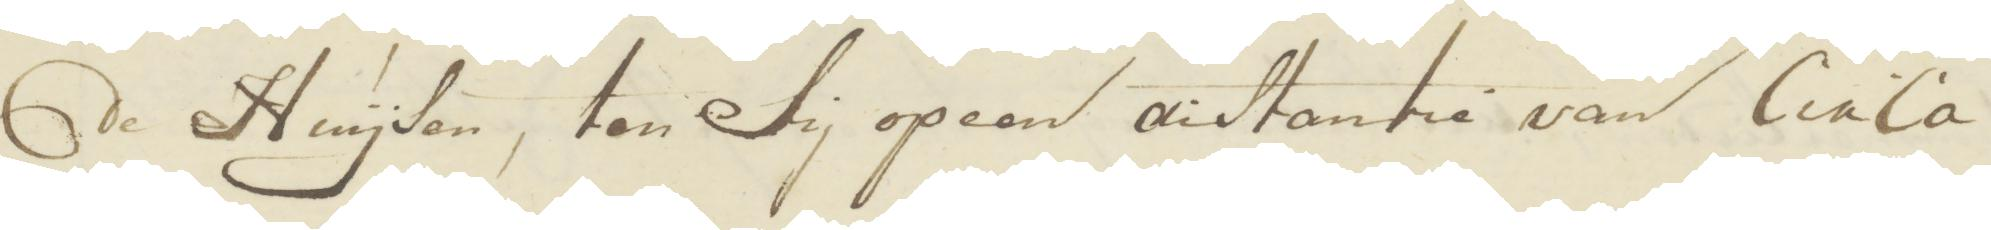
de Huijsen, ten sij op een distantie van Circa
